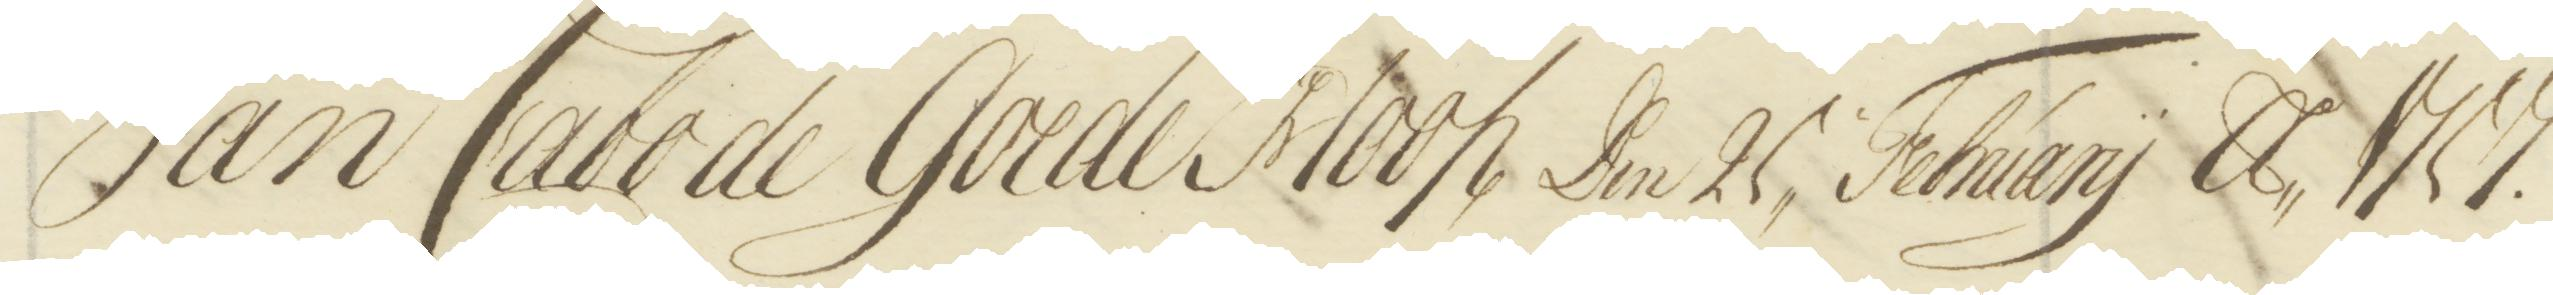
Van Cabo de Goede Hoop Den 25„' Febuarij A„o 1757.
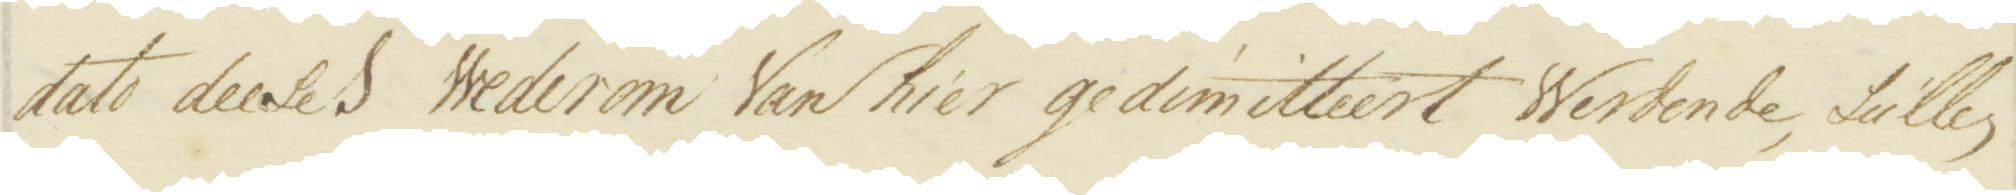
dato deeses wederom van hier gedimitteert werdende, sullen
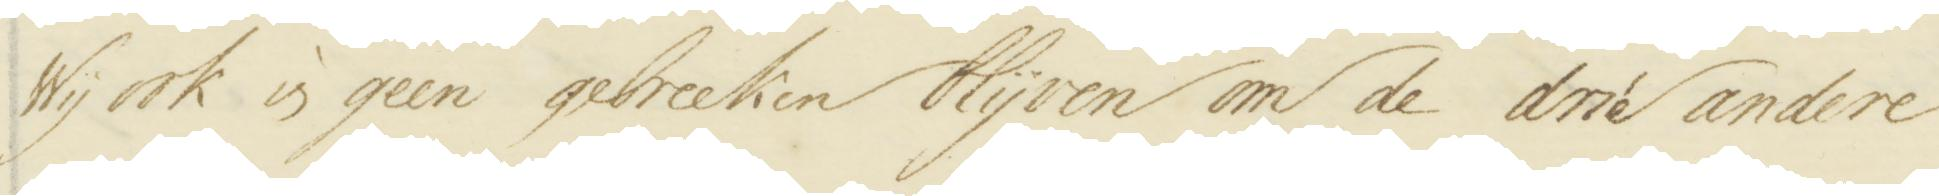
wij ook in geen gebreeken blijven om de drie andere
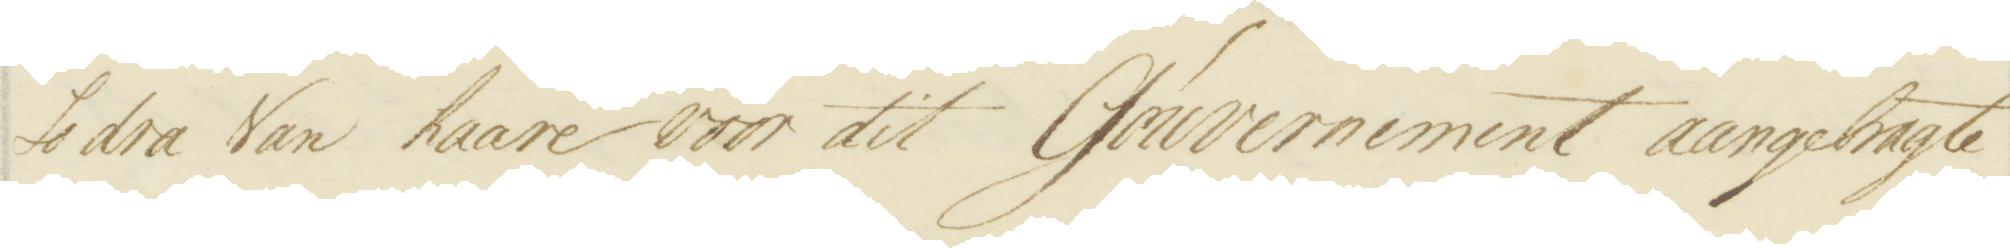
sodra van haare voor dit Gouvernement aangebragte
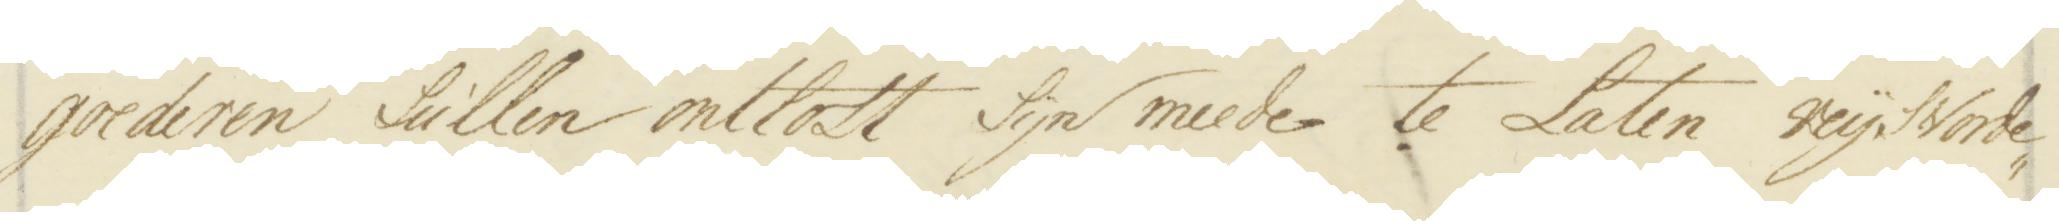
goederen sullen ontlost sijn meede te laten reijsvorde„
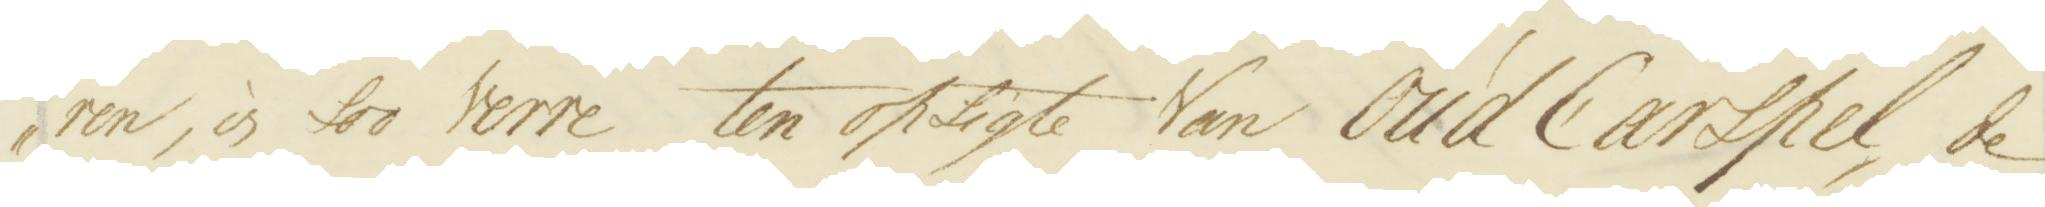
„ren, en soo verre ten opsigte van Oud Carspel, de
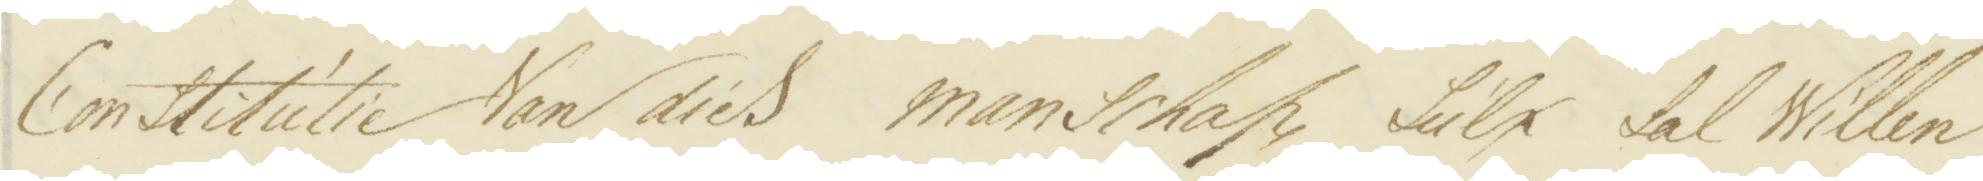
Constitutie van dies manschap sulx sal willen
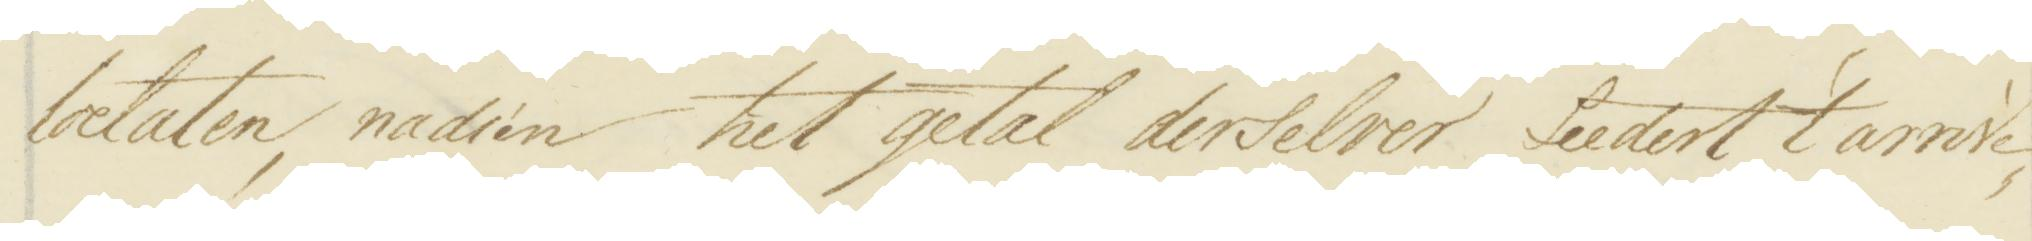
toelaten, nadien het getal derselver seedert 't arrive„
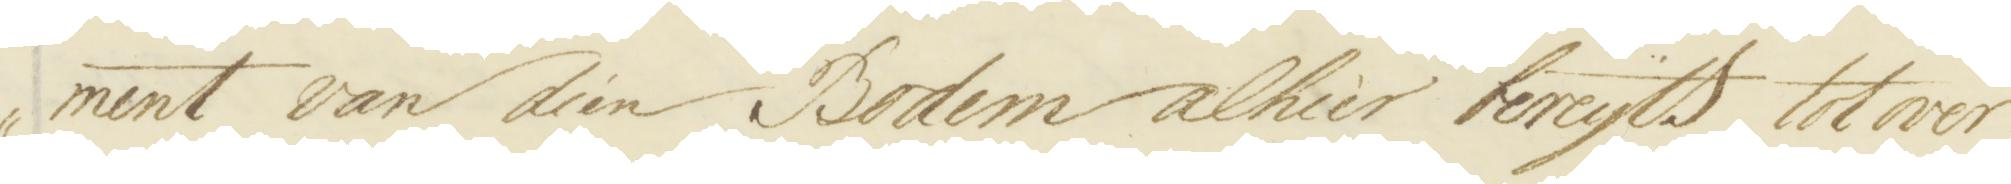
„ment van dien Bodem alhier bereijts tot over
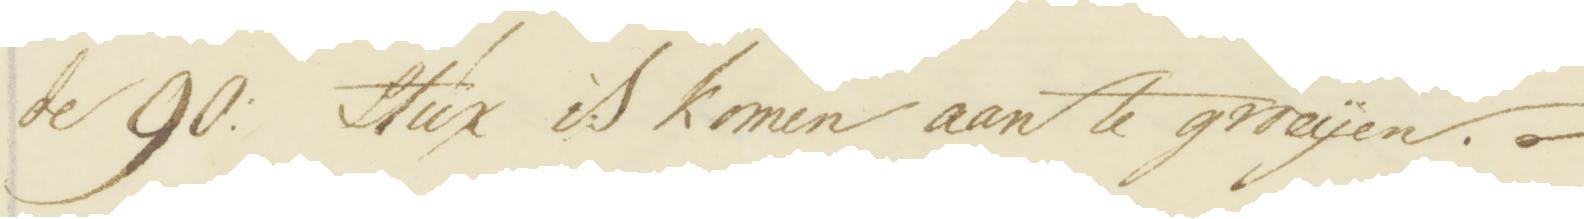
de 90: stux is komen aan te groeijen. —
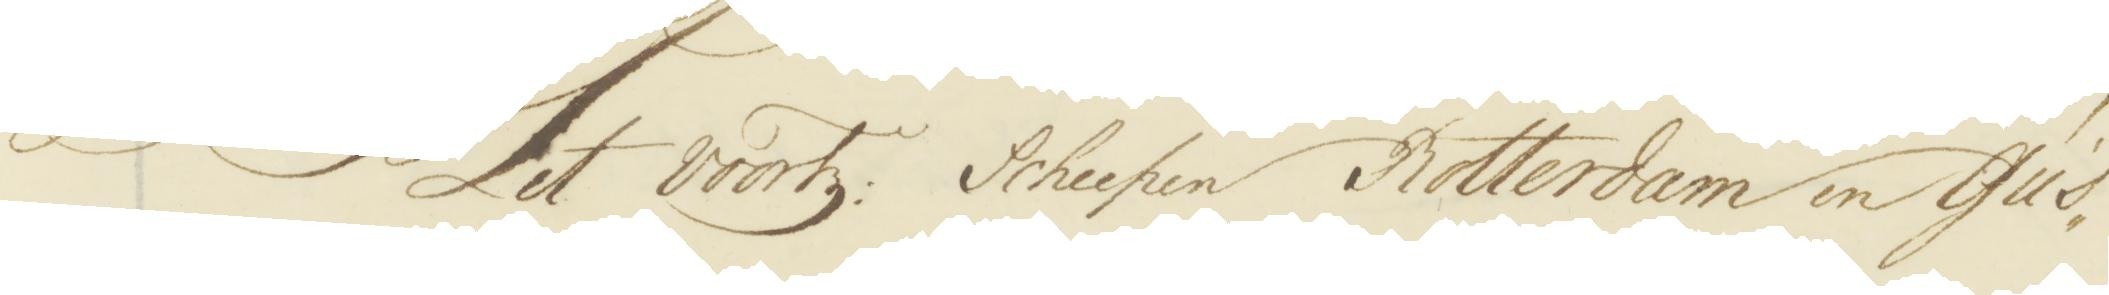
Met voorsz: scheepen Rotterdam en Gus„
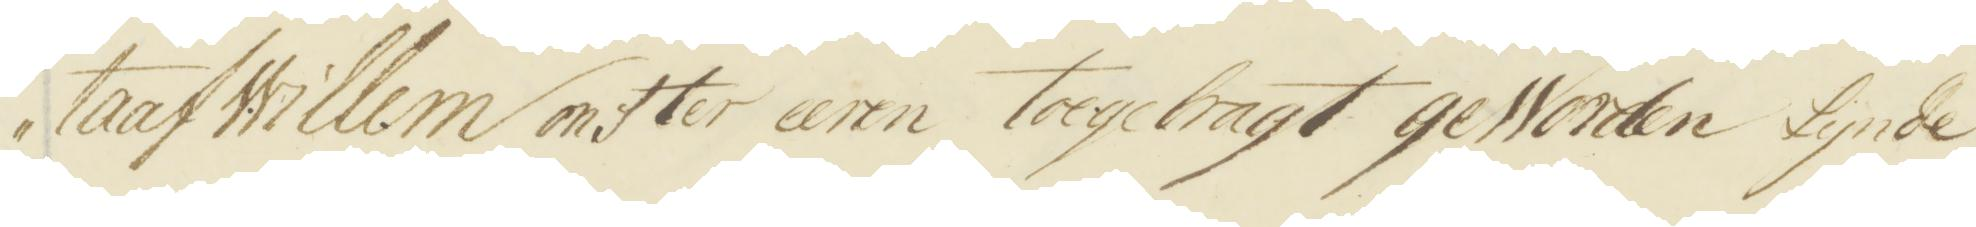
„taaf Willem ons ter eeren toegebragt geworden sijnde
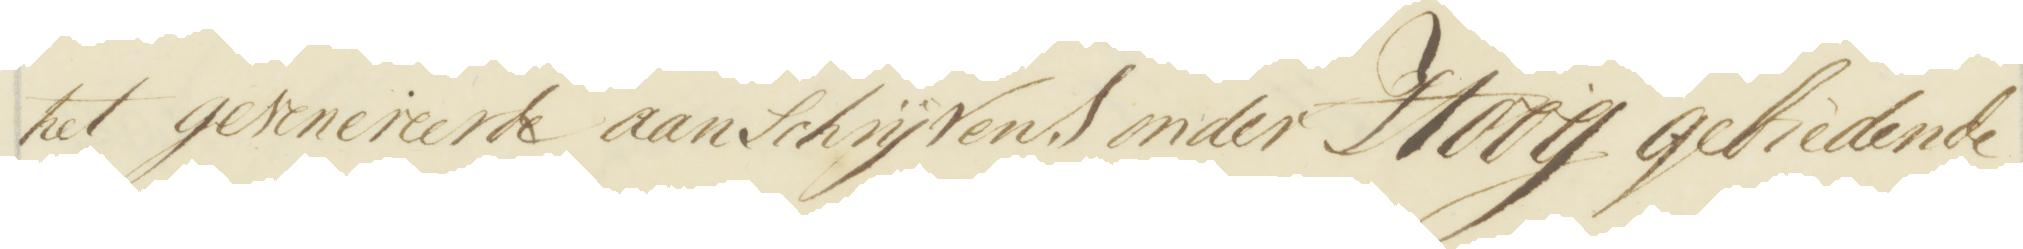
het gevenereerde aanschrijvens onder Hoog gebiedende
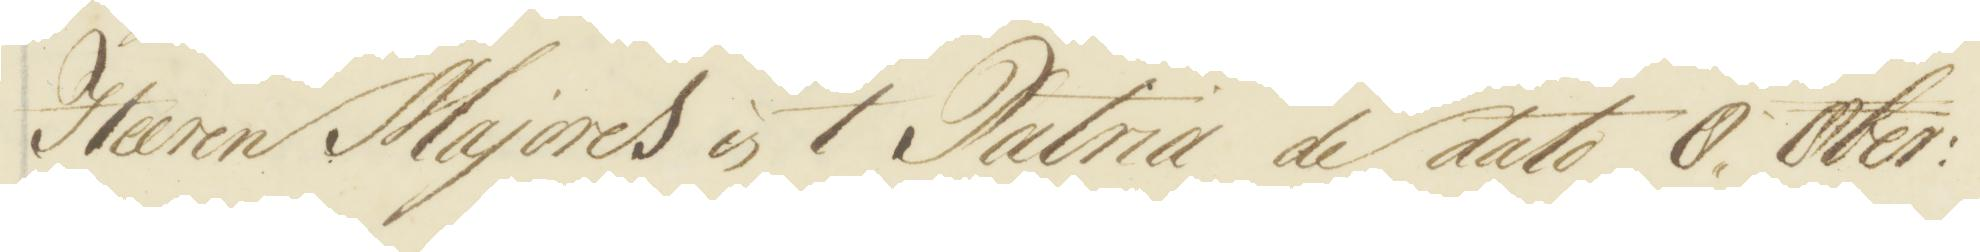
Heeren Majores in ’t Patria de dato 8„' 8ber:
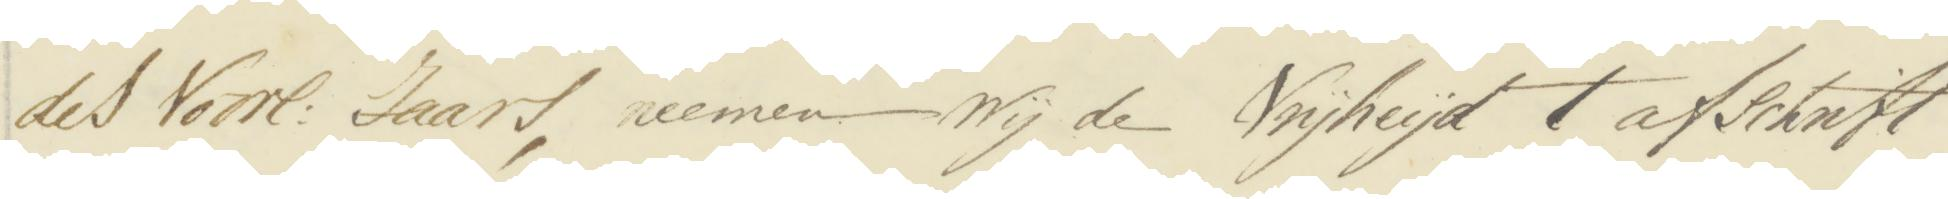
des voorl: Iaars, neemen wij de vrijheijd ’t afschrift
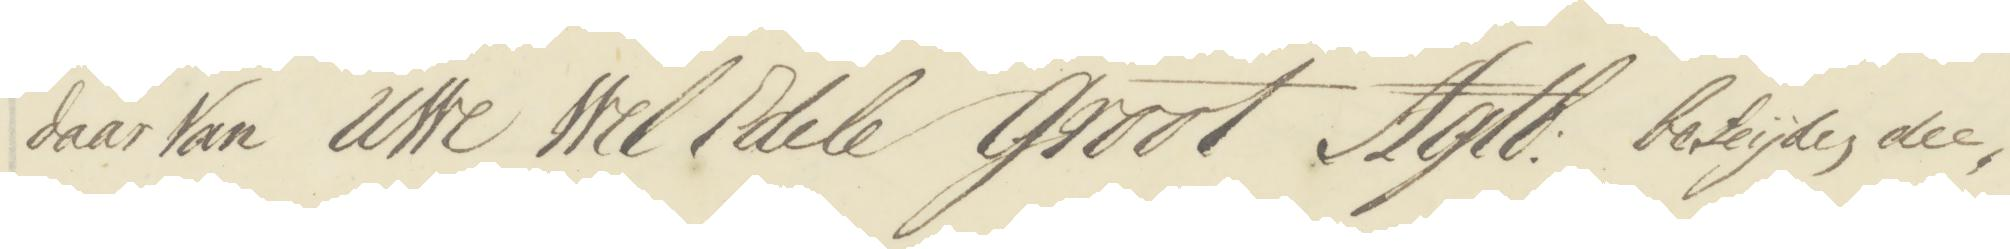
daar van uwe Wel Edele Groot Agtb: beseijden dee„
